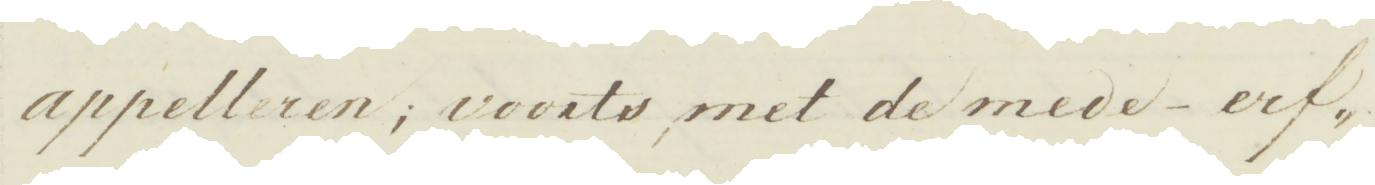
appelleren; voorts, met de mede - erf„
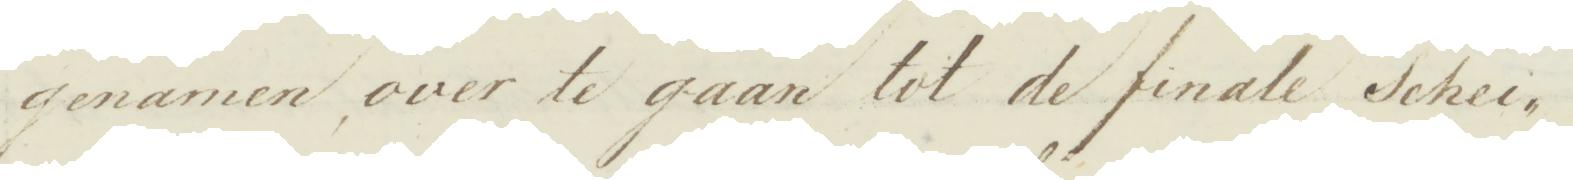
genamen, over te gaan tot de finale schei„
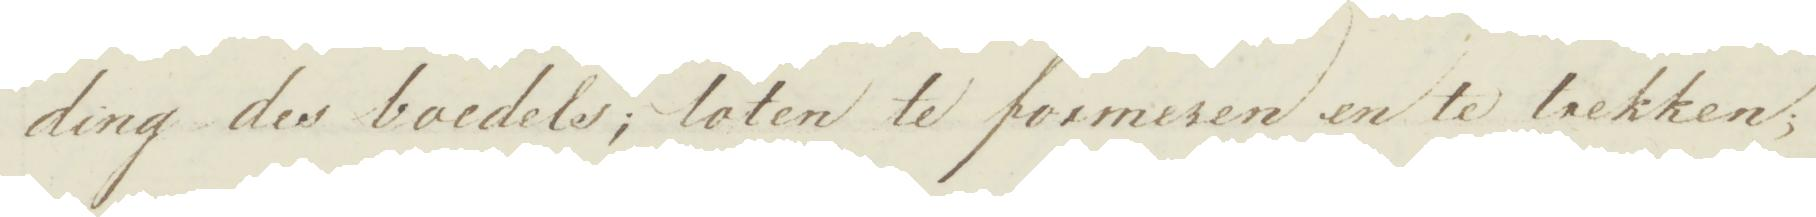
ding des boedels; laten te formeren en te trekken;
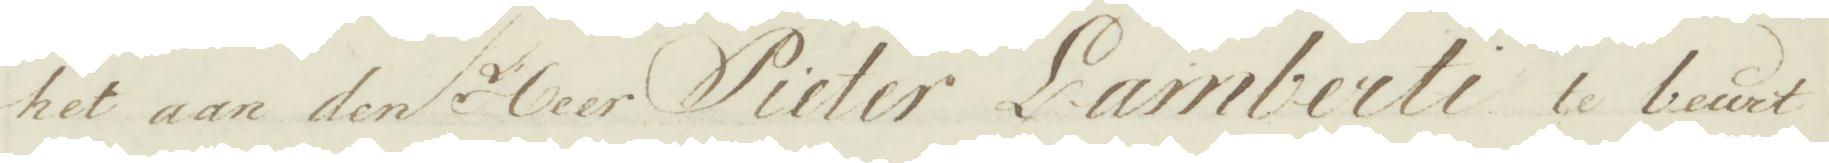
het aan den Heer Pieter Lamberti te beurt
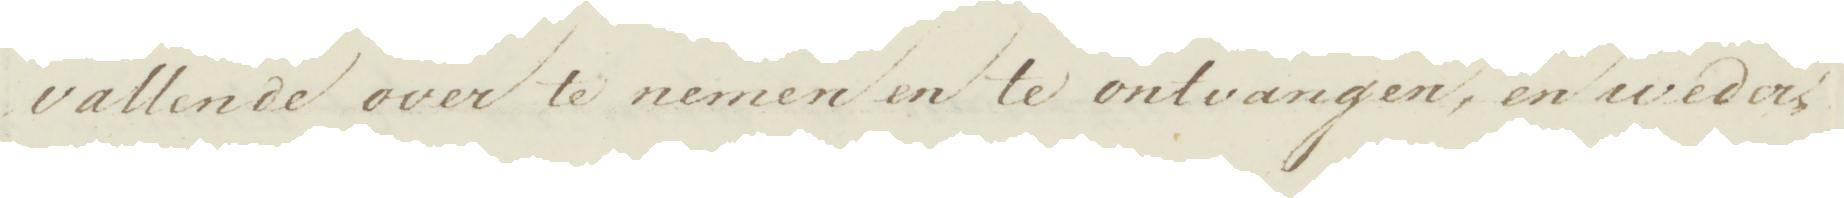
vallende over te nemen en te ontvangen, en weder„
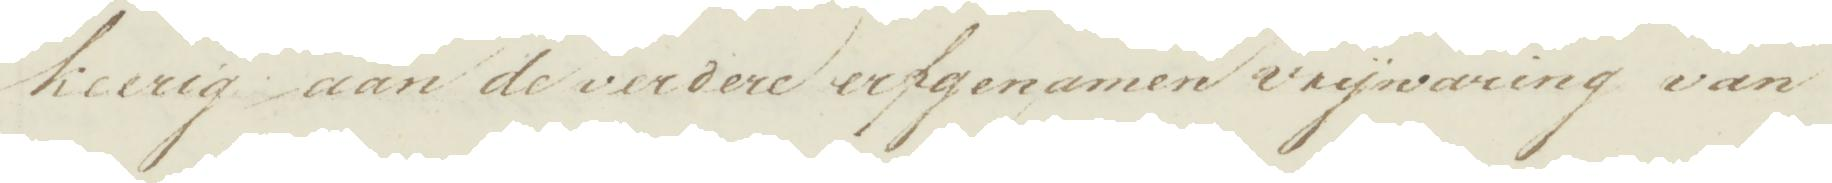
keerig aan de verdere erfgenamen vrijwaring van
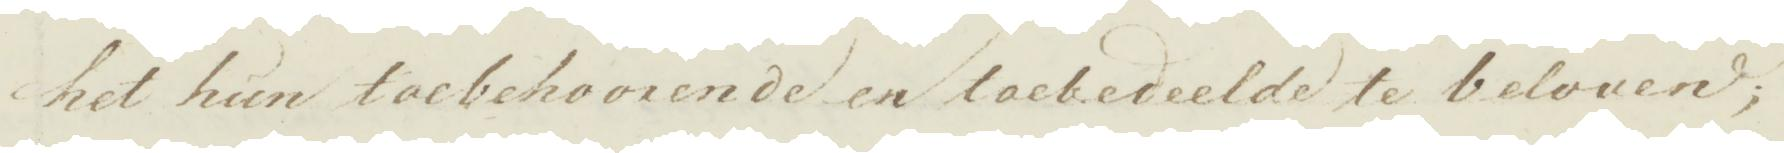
het hun toebehoorende en toebedeelde te beloven;
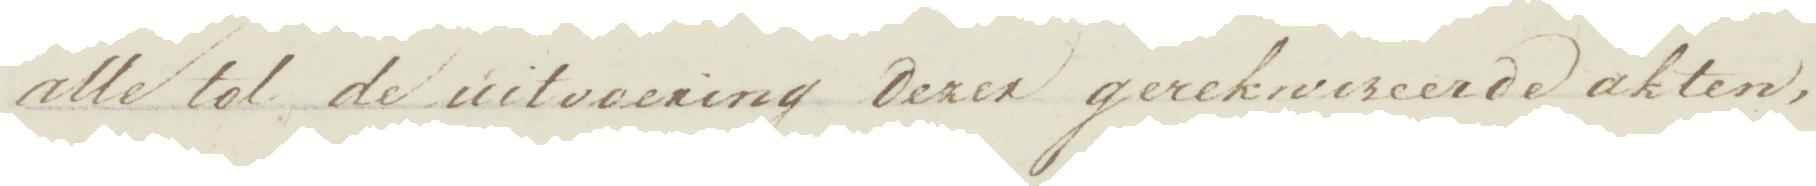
alle tot de uitvoering dezer gerekwiseerde akten,
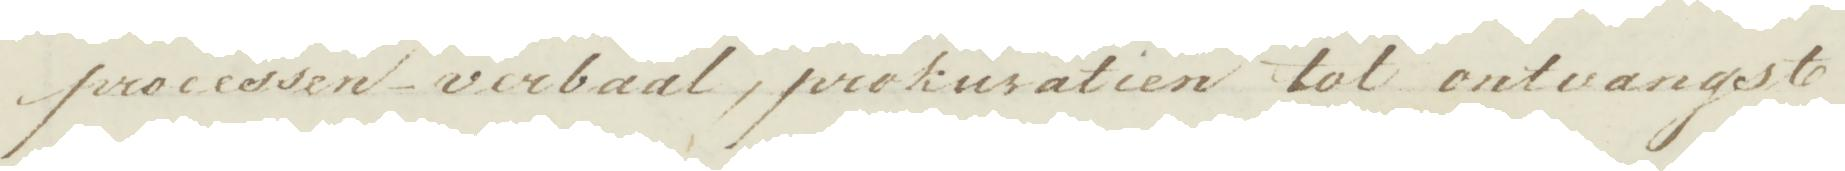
processen-verbaal, prokuratien tot ontvangst
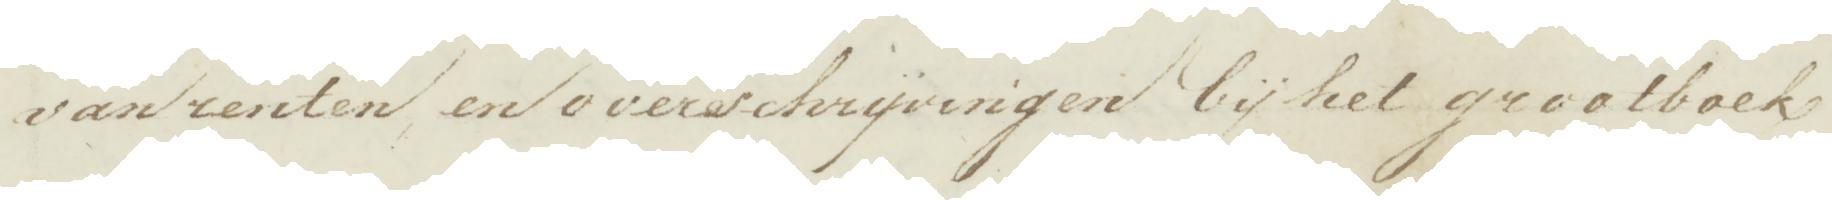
van renten, en overschrijvingen bij het grootboek
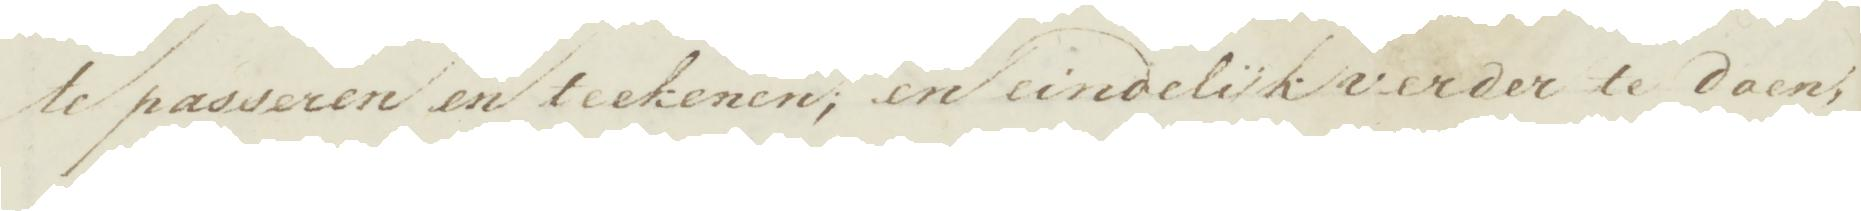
te passeren en teekenen; en eindelijk verder te doen;
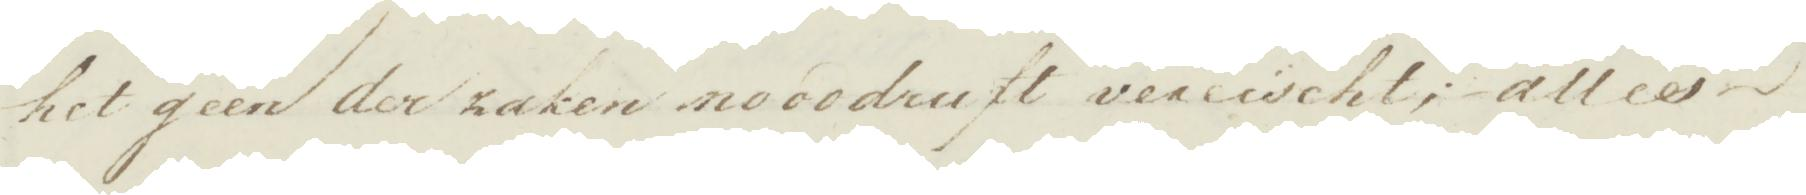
het geen der zaken nooddruft vereischt; alles
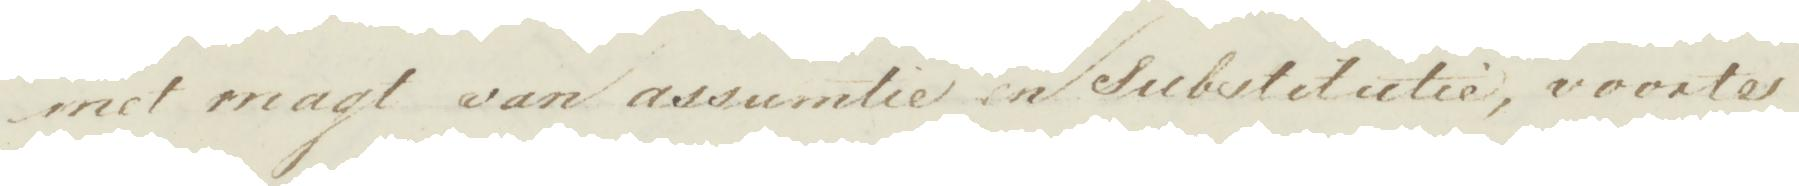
met magt van assumtie en substitutie, voorts
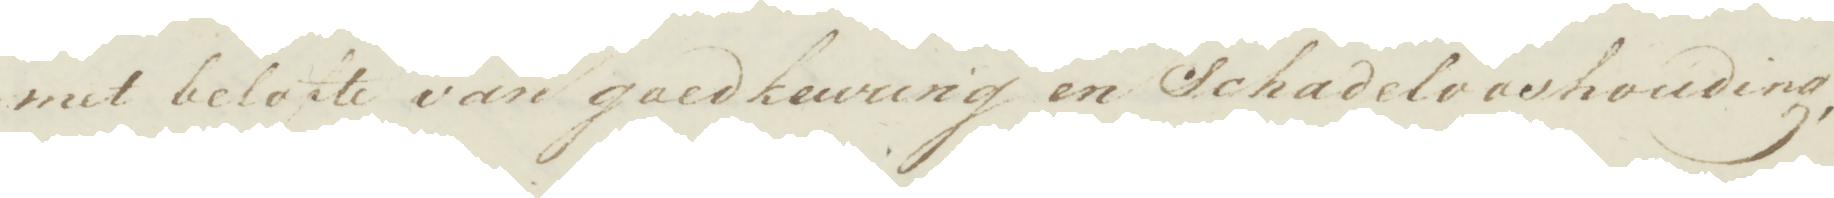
met belofte van goedkeuring en schadelooshouding,
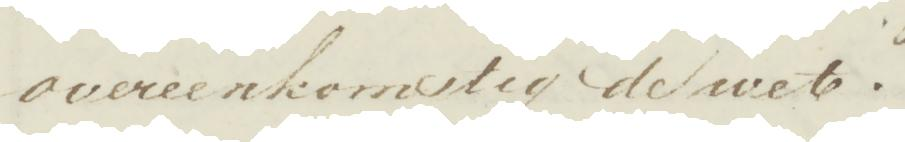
overeenkomstig de wet.
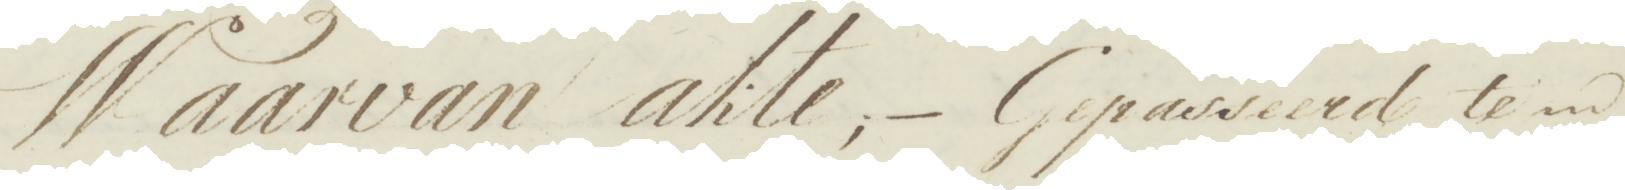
Waarvan akte; — Gepasseerd te
